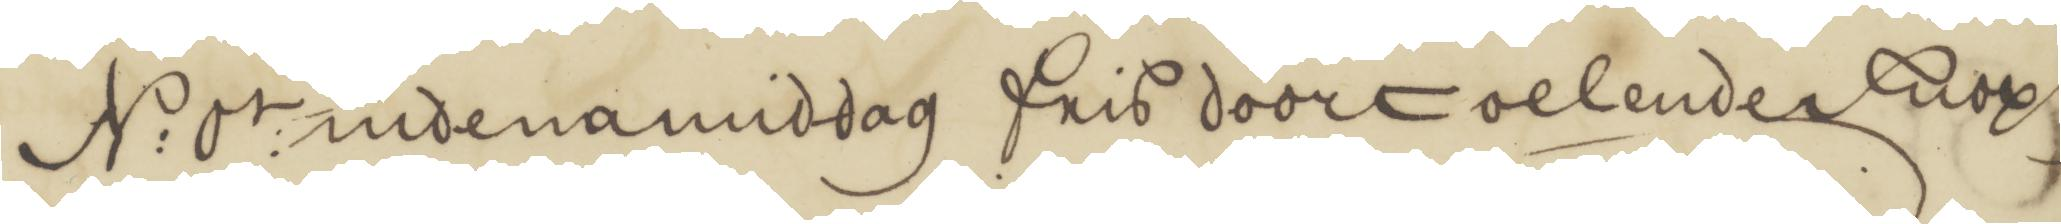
N: o:t indenamiddag fris doorcoelende Enop„
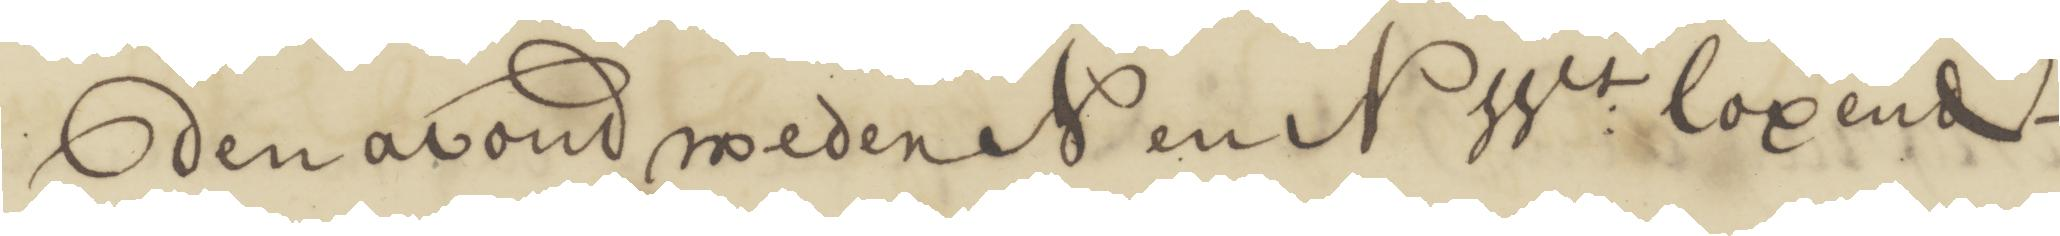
den avond weder N en N: W:t lopende
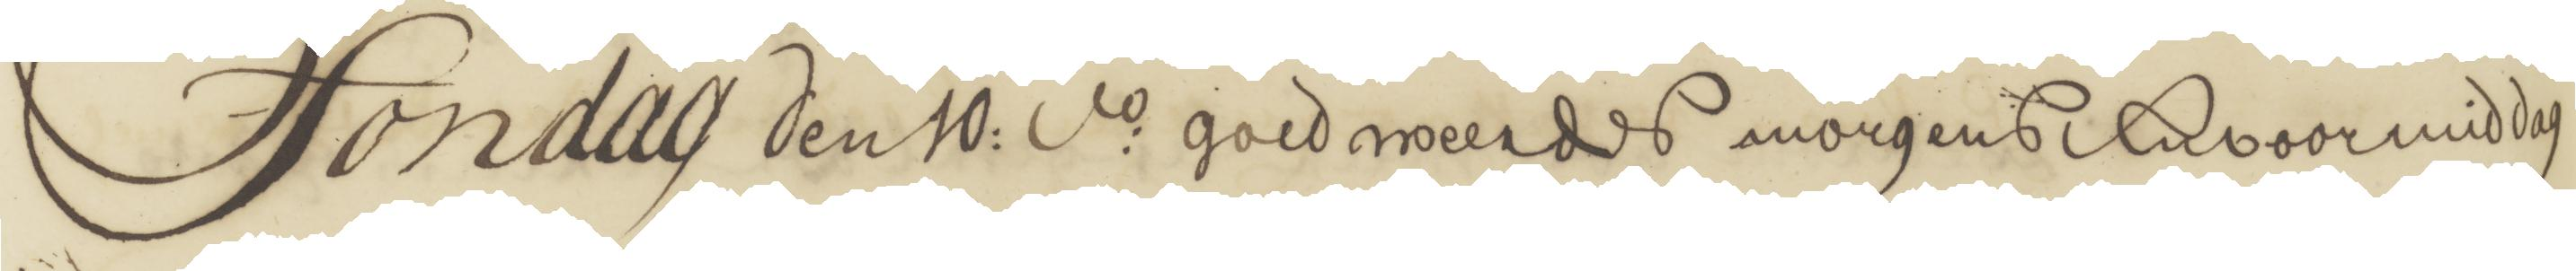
Sondag den 10: d:o goed weer des morgens En voormiddag
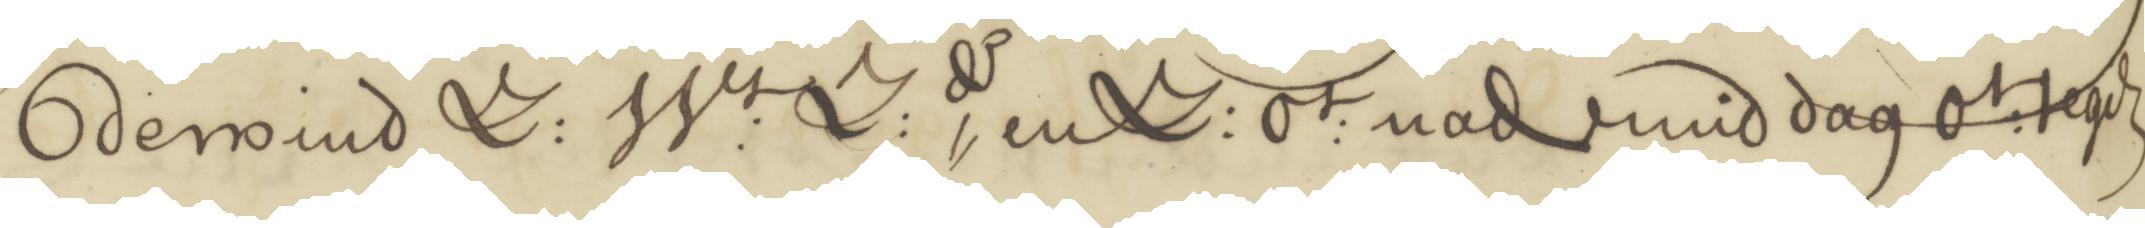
dewind Z: W:t Z: d„o en Z: o:t nademiddag o:t tegen
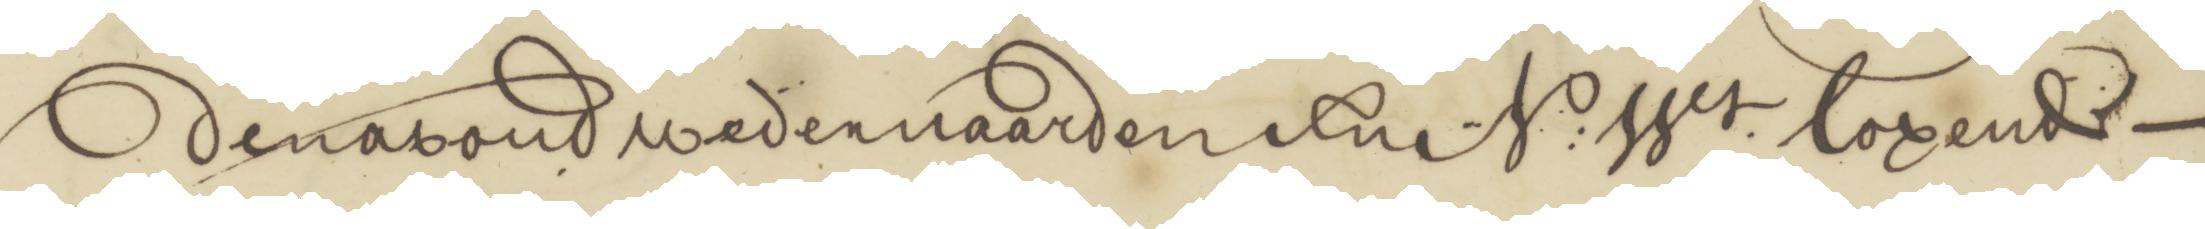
den avond weder naar den En N: W:t lopende —
